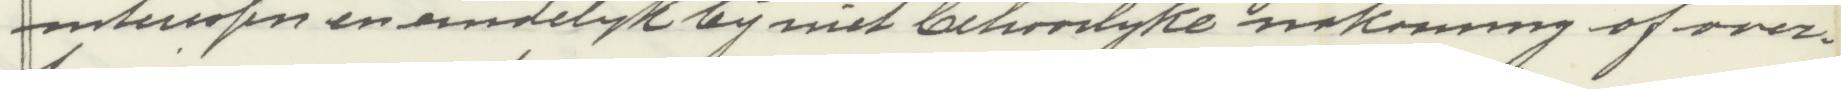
interessen en eindelijk bij niet behoorlijke nakoming of over„
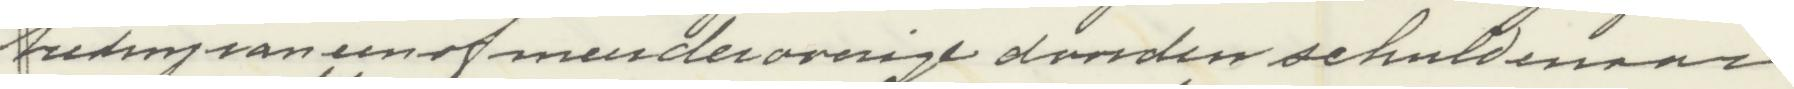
treding van een of meer der overige door den schuldenaar
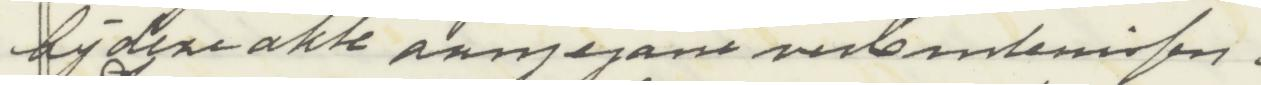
bij deze akte aangegane verbintenissen.
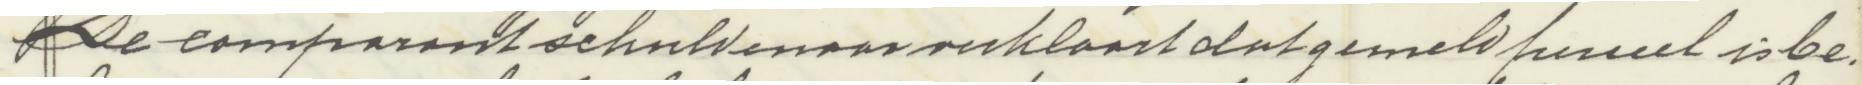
De comparant schuldenaar verklaart dat gemeld perceel is be„
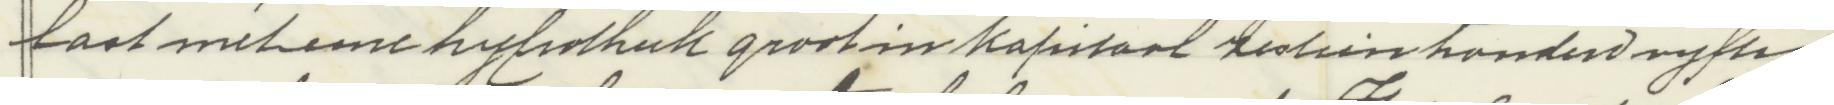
last met eene hypotheek groot in kapitaal zestien honderd vjftig
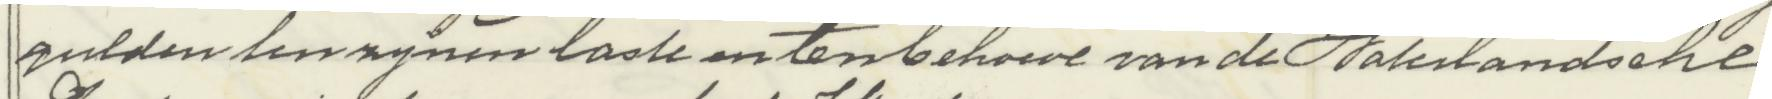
gulden ten zynen laste en ten behoeve van de Waterlandsche
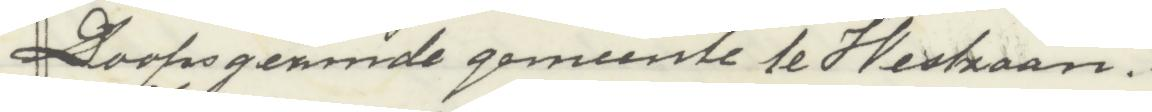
Doopsgezinde gemeente te Westzaan.
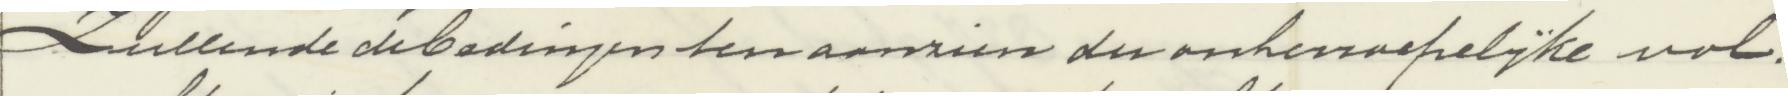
Zullende de bedingen ten aanzien der onherroepelijke vol.
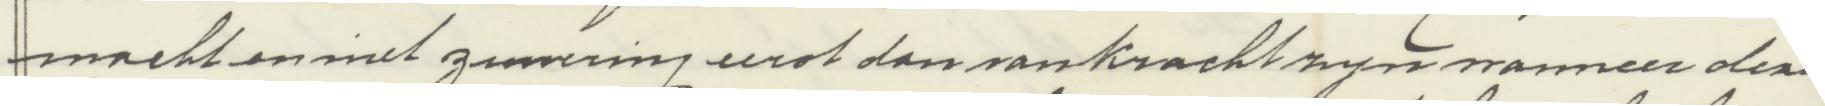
macht en niet zuivering eerst dan van kracht zyn wanneer deze
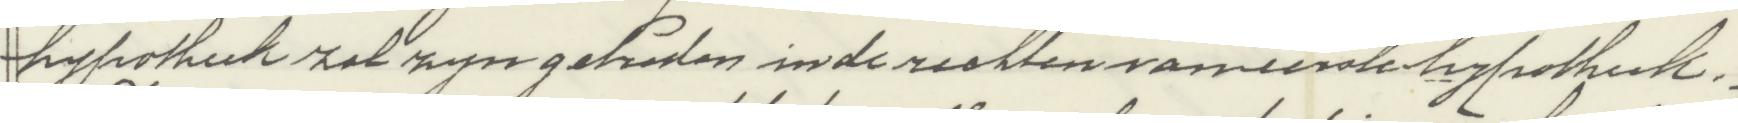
hypotheek zal zyn getreden in de rechten van eerste hypotheek.
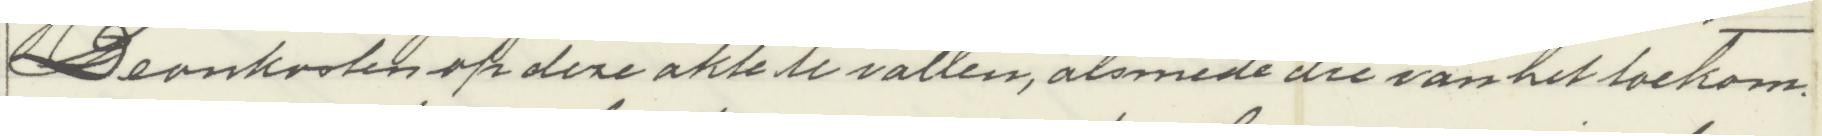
De onkosten op deze akte te vallen, alsmede die van het toekom,
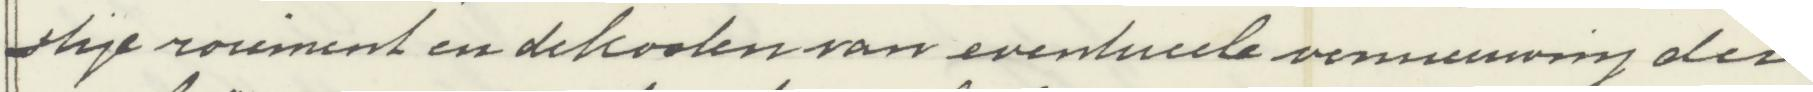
stige roiement en de kosten van eventueele vernieuwing der
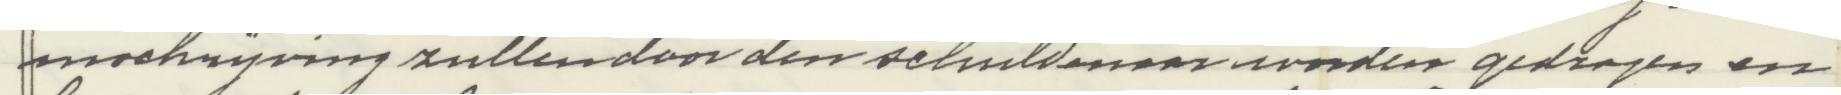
inschrijving zullen door den schuldenaar worden gedragen en
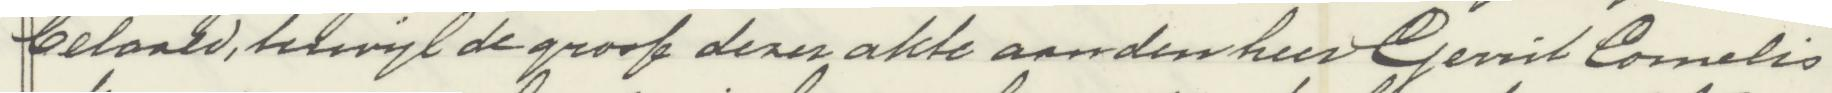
betaald, terwijl de grosse dezer akte aan den heer Gerrit Cornelis
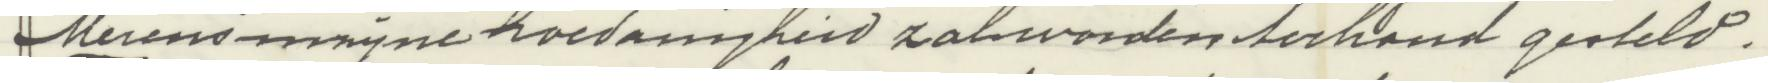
Merens in zijne hoedanigheid zal worden terhand gesteld.
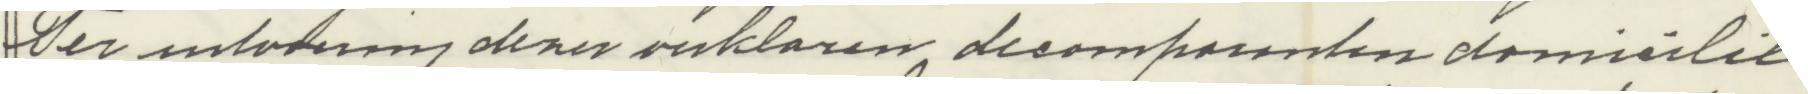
Ter uitvoering dezes verklaren de comparanten domicilie
